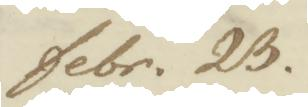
febr. 23.
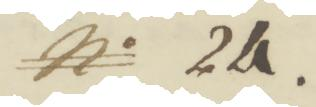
N=o 24.
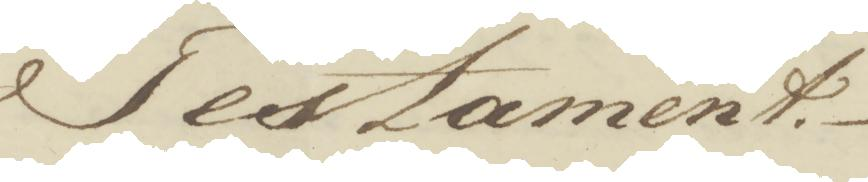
Testament. —
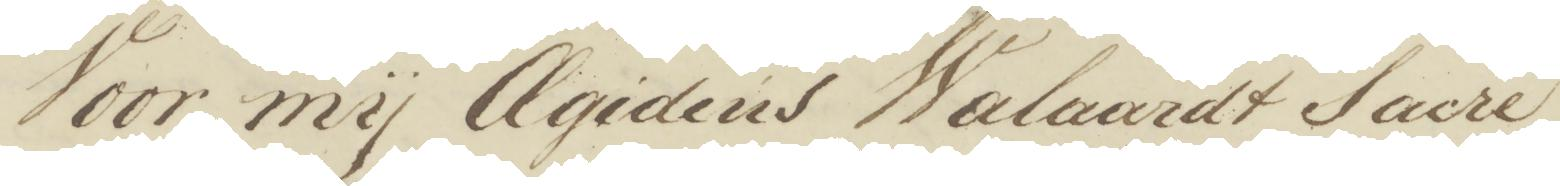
Voor mij AEgideus Walaardt Sacré,
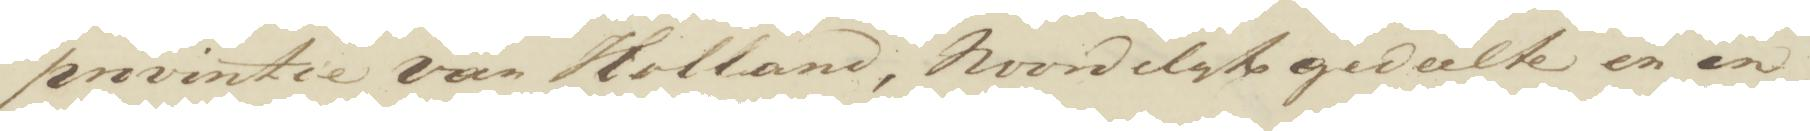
provintie van Holland, Noordelyk gedeelte en in
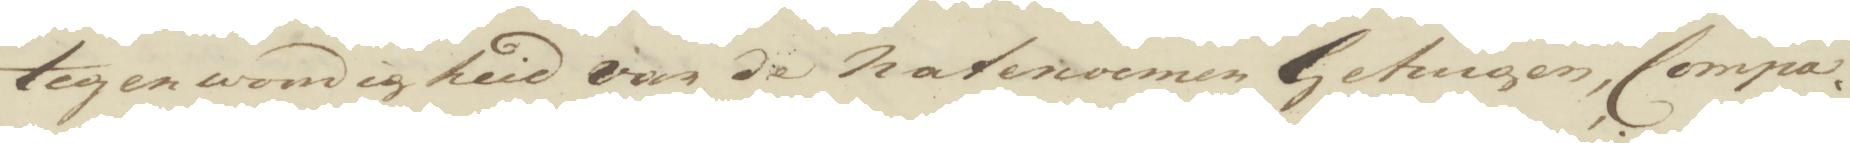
tegenwondigheid van de natenoemen Getuigen, Compa„
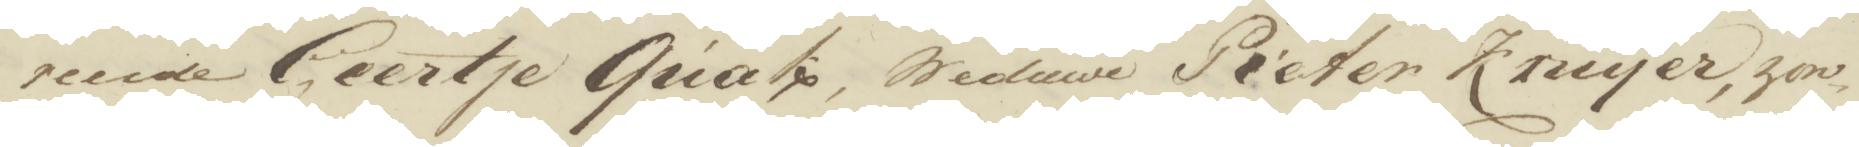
reerde Geertje Quak, weduwe Pieter Kruijer, zon„
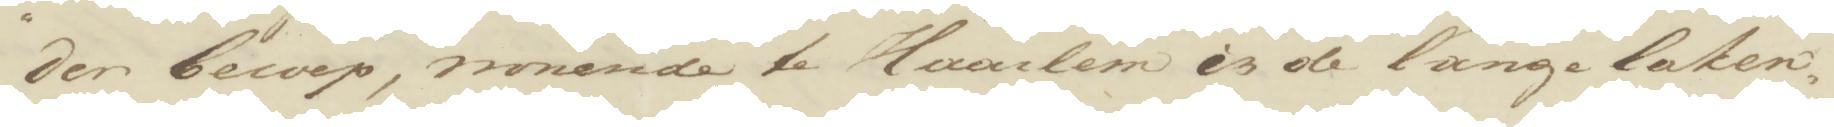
der beroep, wonende te Haarlem in de lange laken„
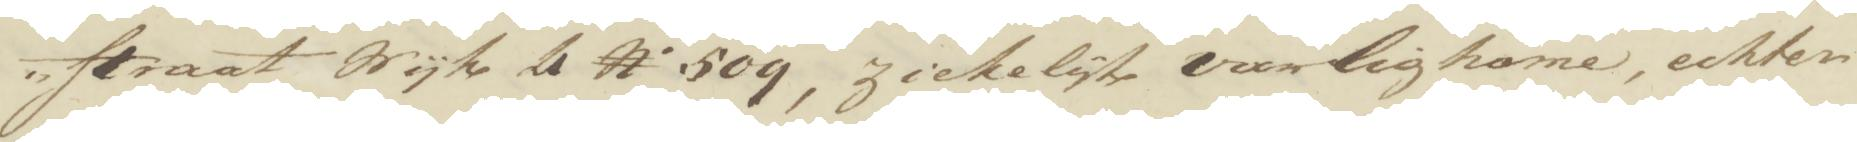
„straat wijk 4 N=o 509, ziekelijk van lighame, echter
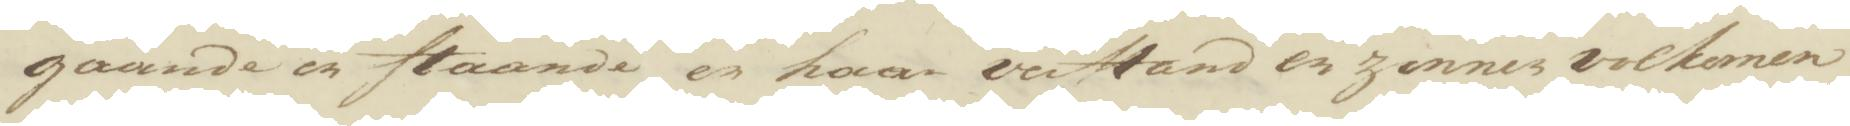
gaande en staande, en haar verstand en zinnen volkomen
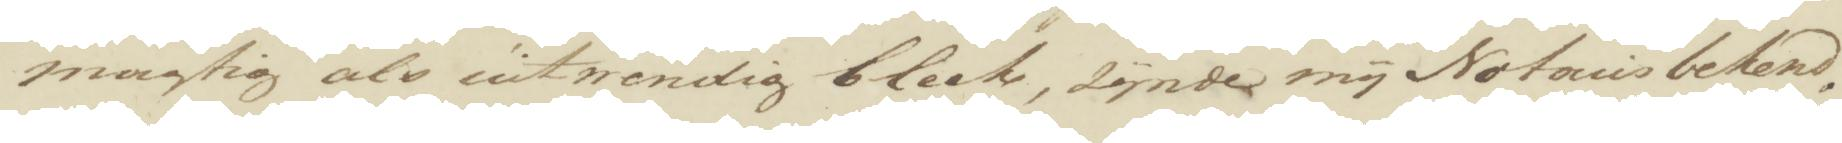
magtig als uitwendig bleek, zijnde mij Notaris bekend.
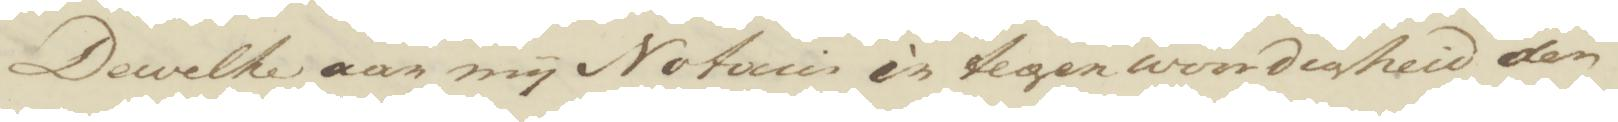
Dewelke aan mij Notaris in tegenwoordigheid den
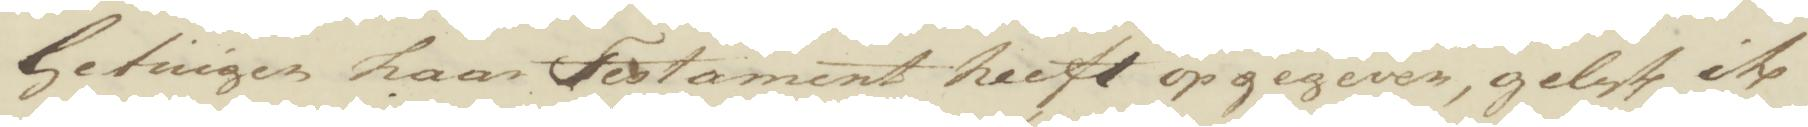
Getuigen haar Testament heeft opgegeven, gelyk ik
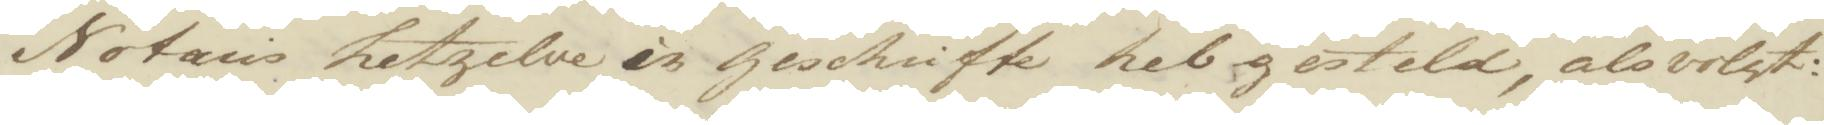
Notaris hetzelve in geschrifte heb gesteld, als volgt
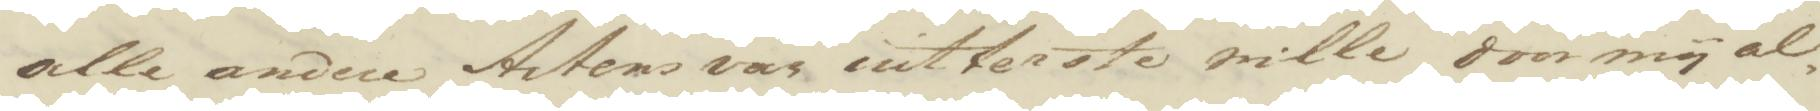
alle andere Actens van uitterste wille, door mij al
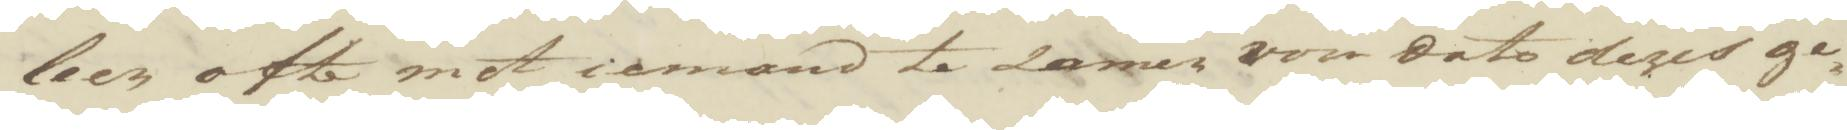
,leen ofte met iemand te zamen voor dato dezes ge
